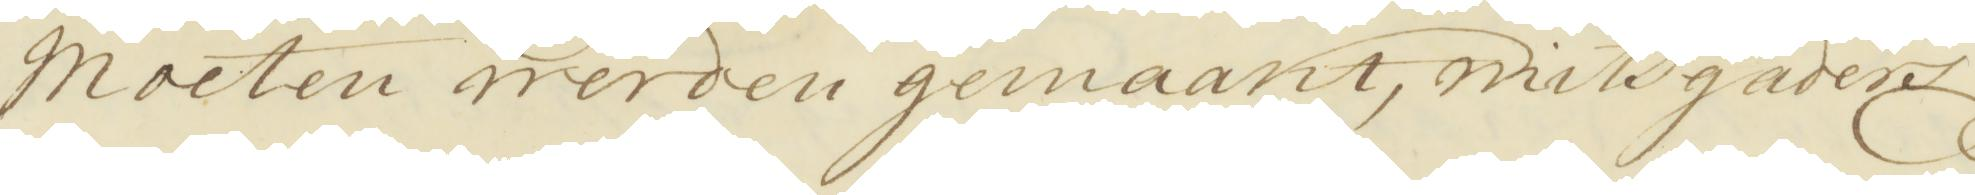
moeten werden gemaakt, mitsgaders
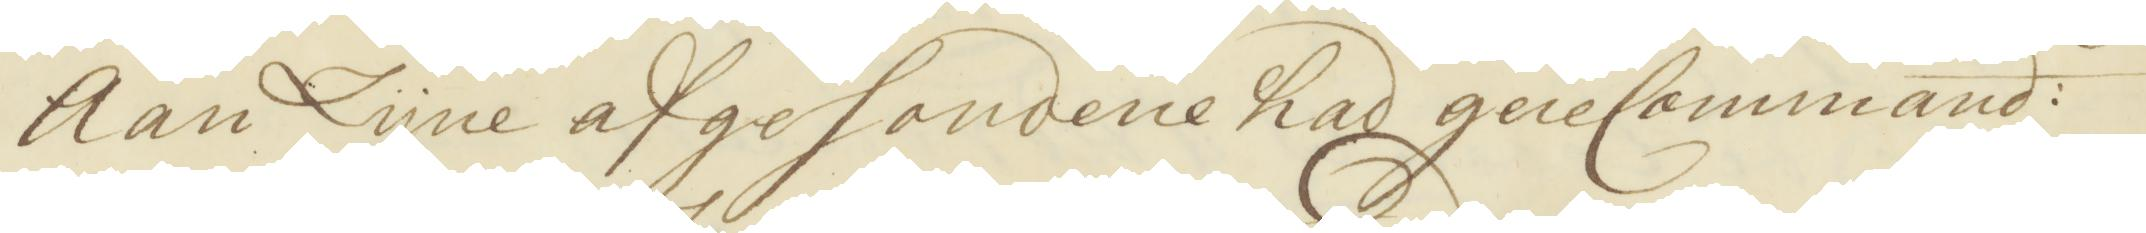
Aan zijne afgesondene had gerecommand:t
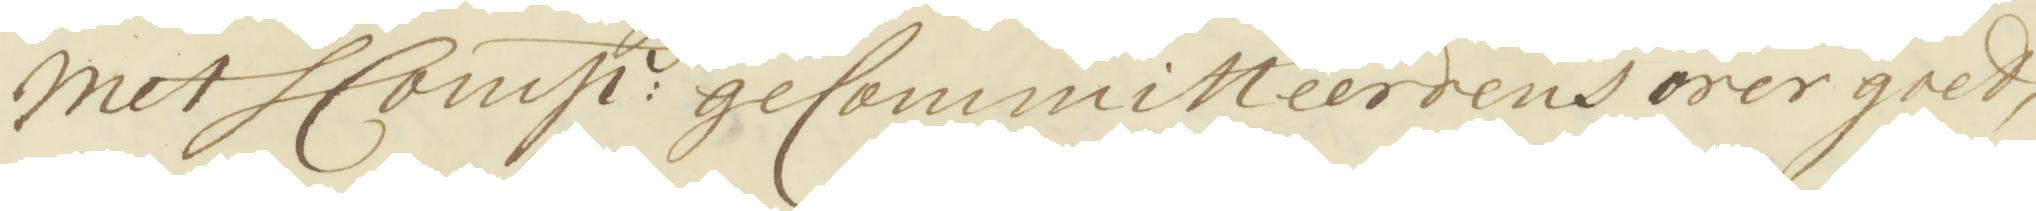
met sComp:s gecommitteerdens over goet,
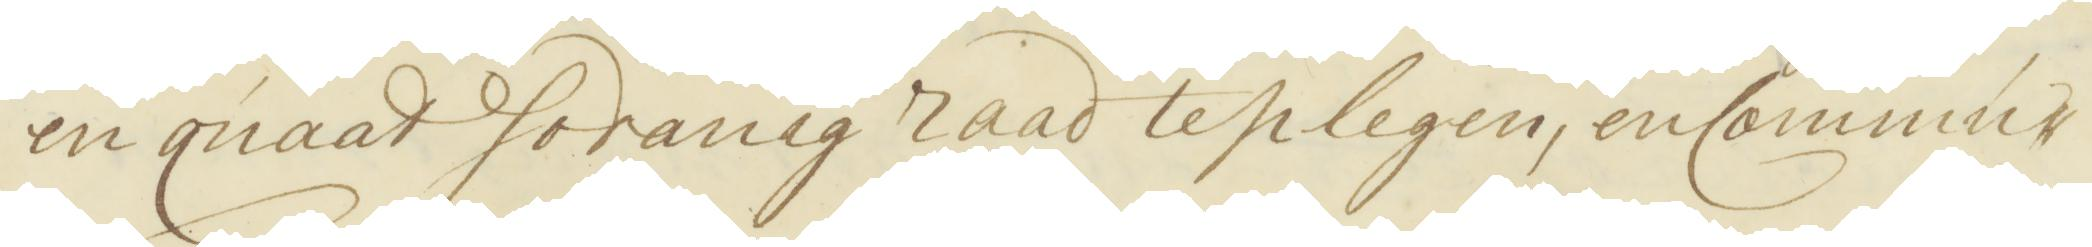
en quaat sodanig raad te plegen, en Commu„
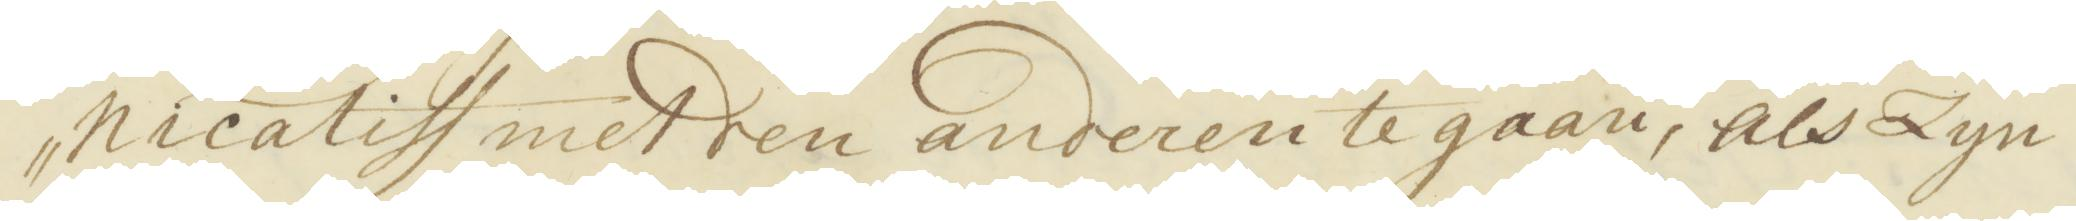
„nicatiff met den anderen te gaan, als zyn
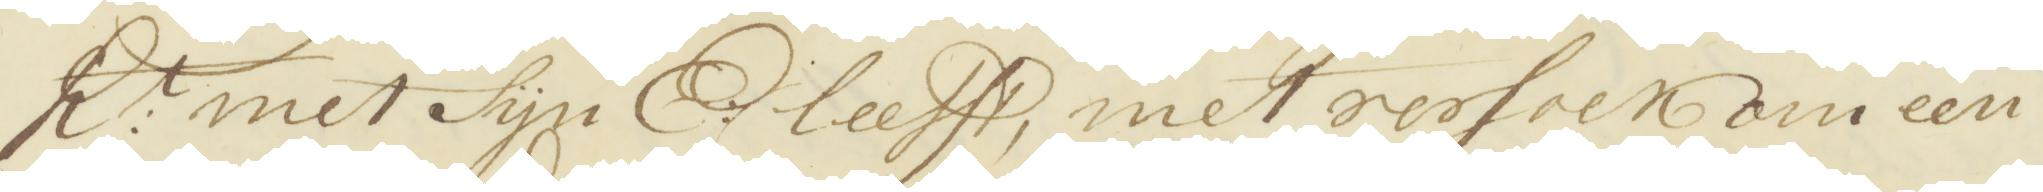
h:t met sijn E: leefft, met versoek om een
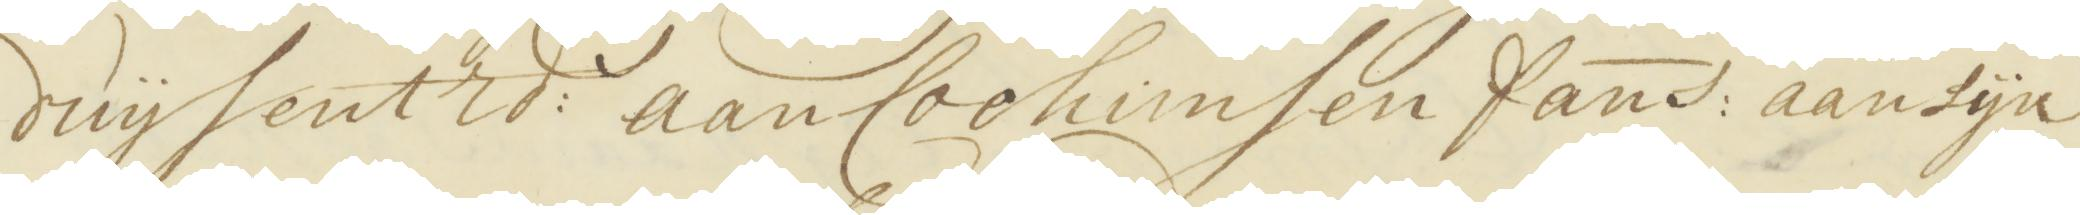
duijsent rd:s aan Cochimsen fans: aansijn
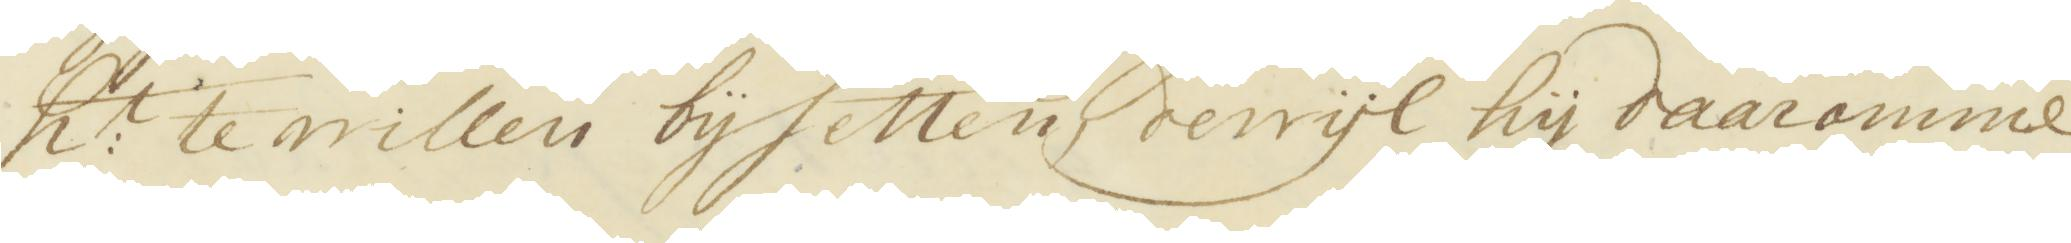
h:t te willen bijsetten dewijl hij daaromme
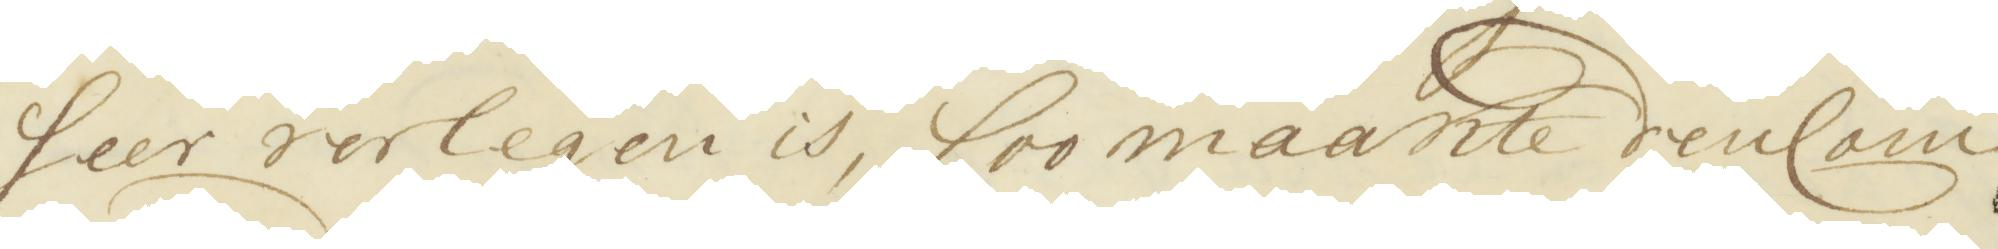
seer verlegen is, soo maakte den Com
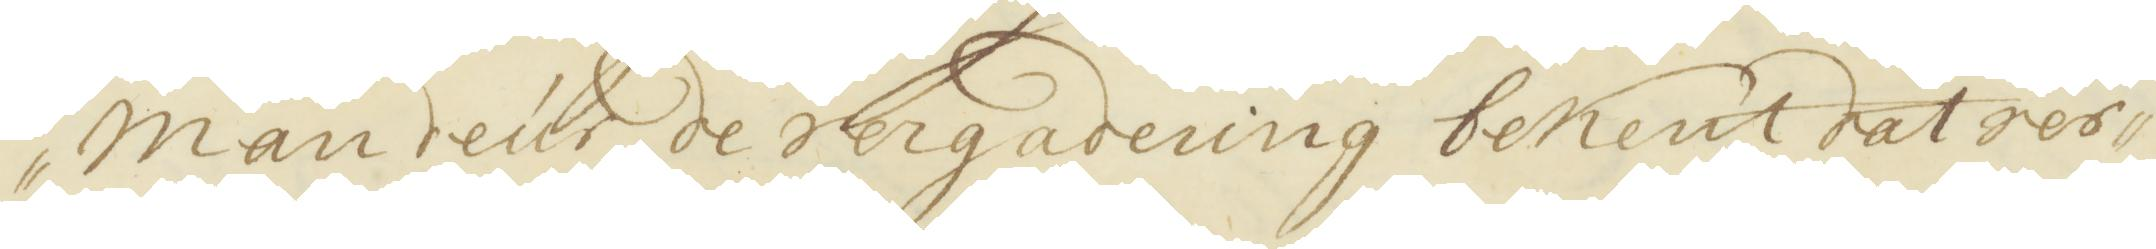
„mandeur de vergadering bekent dat ves„
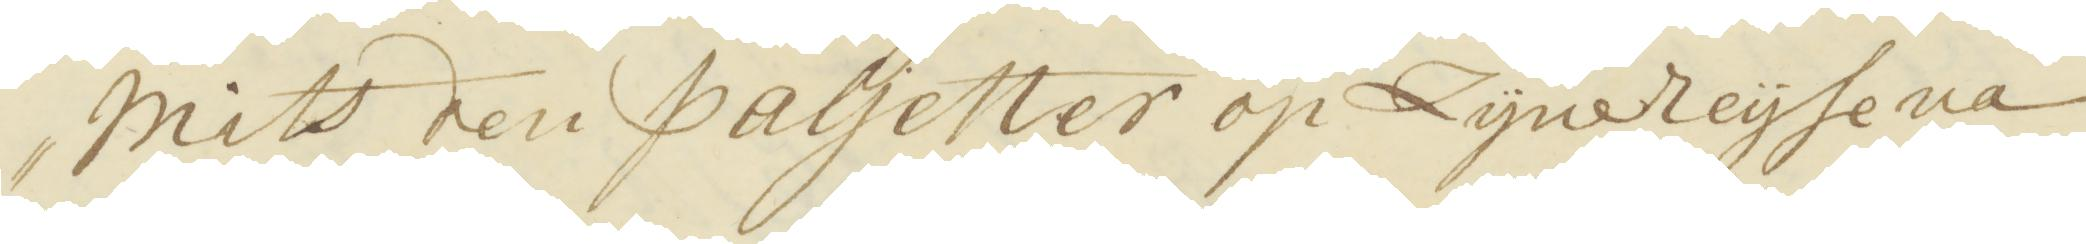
„mits den paljetter op zijne reijse na
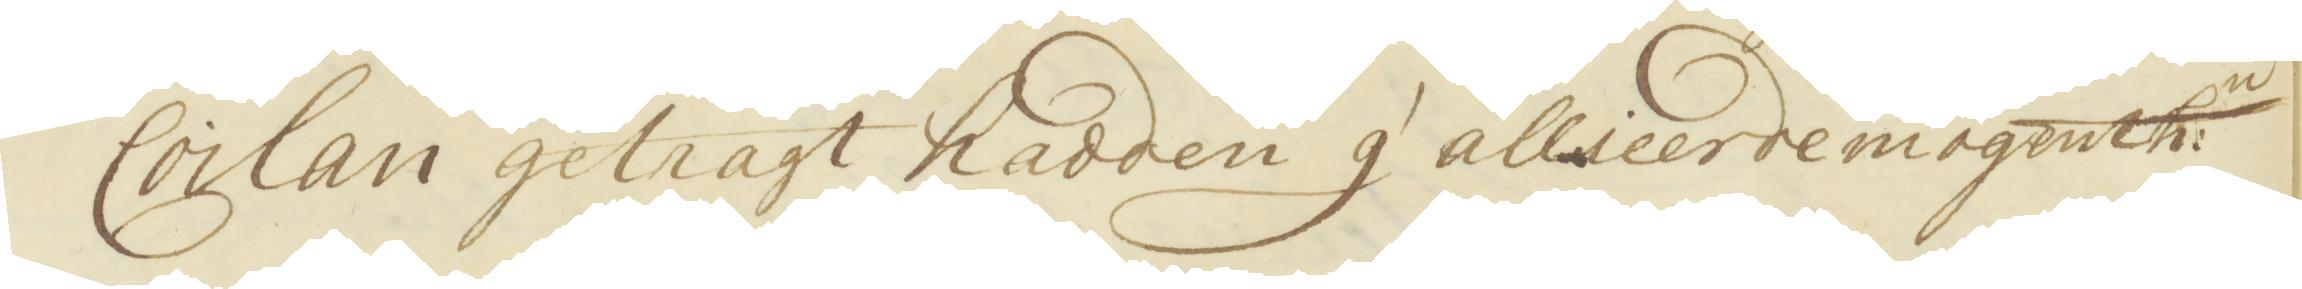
Coilan getragt hadden g’allieerde mogenth:n
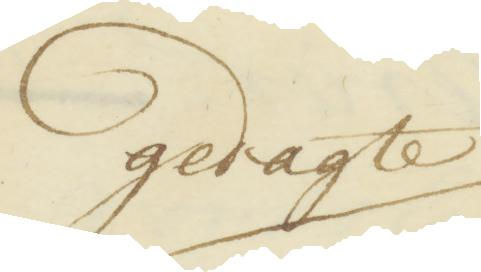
gedagte
